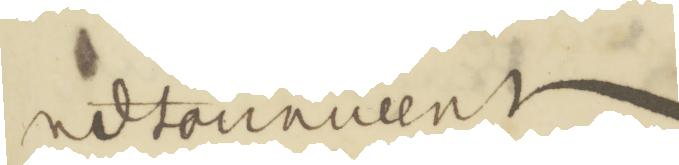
retourneert
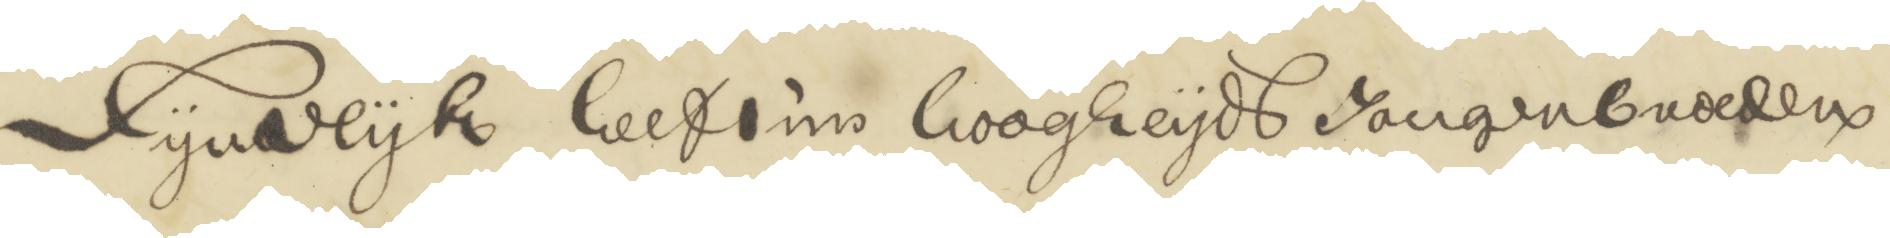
Eijndelijk heeft uw hoogheijds Jongen broeder
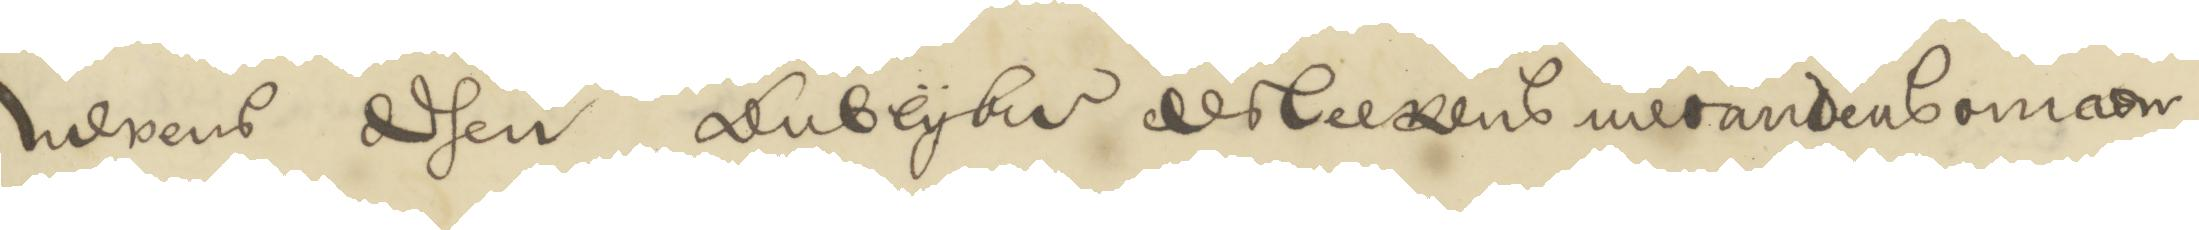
nevens desen teblijke des levens niet andersom aan
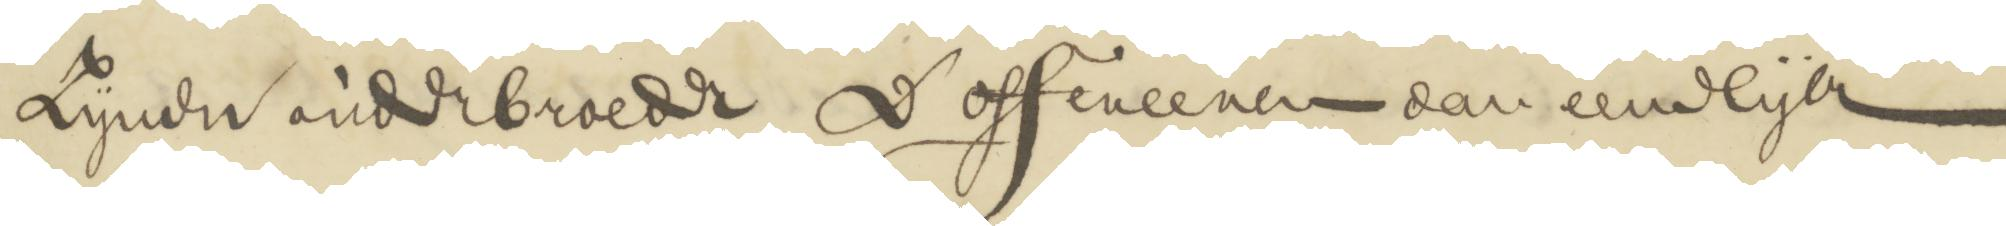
zijnen ouderbroeder te offereeren dan eenelijk
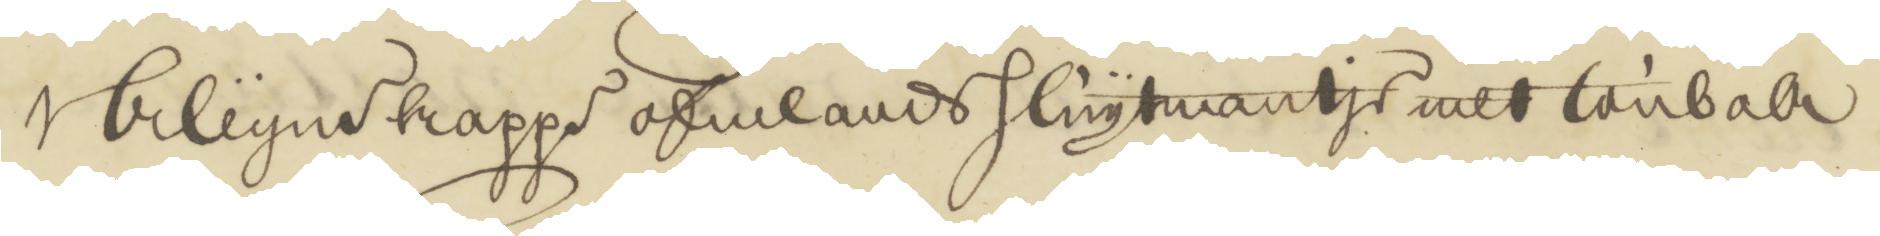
kleijne kappe of inlands sluijtmantje met toubak
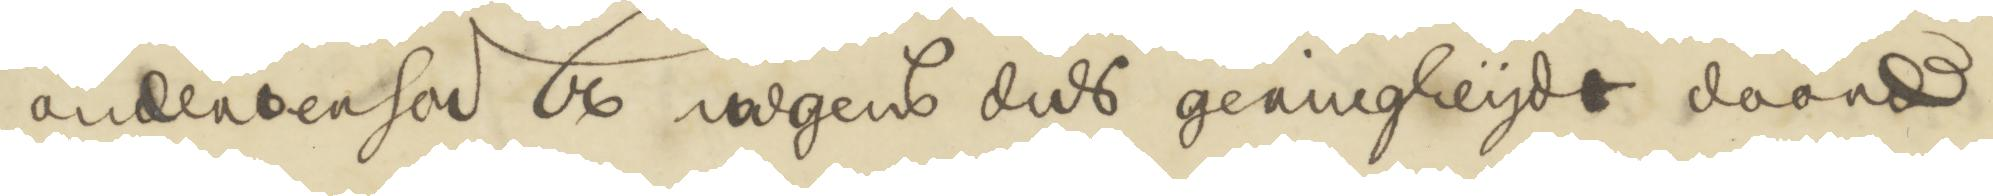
ander versoeke wegens dies geringheijdt daarde
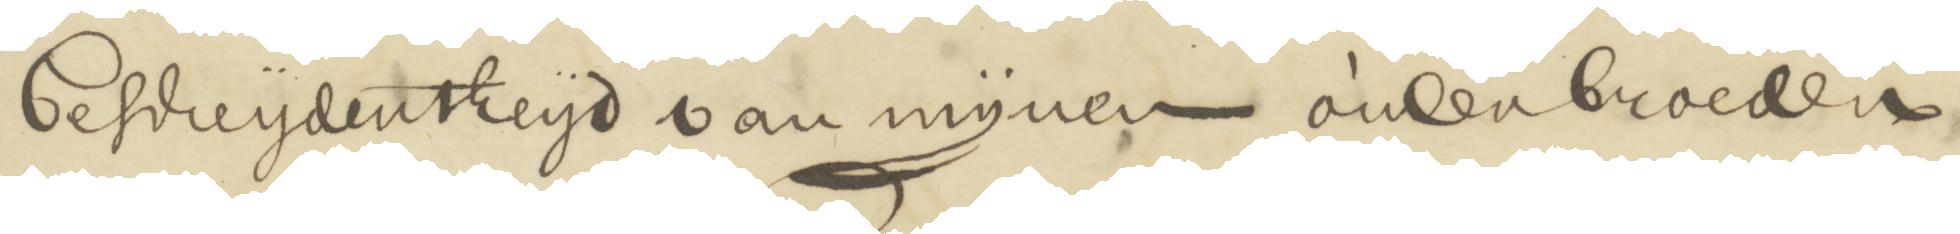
bescheijdentheijd van mijnen ouder broeder
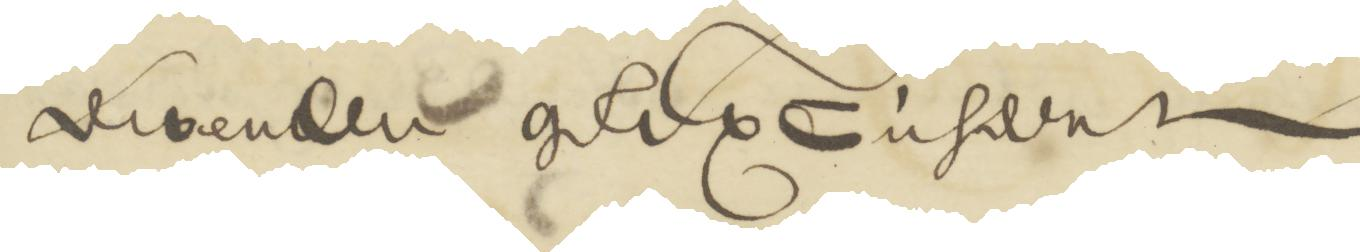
werden geExcuseert.
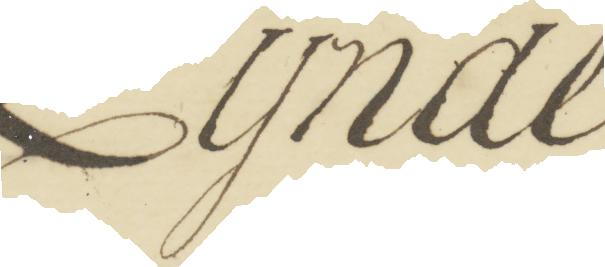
Eijnde
